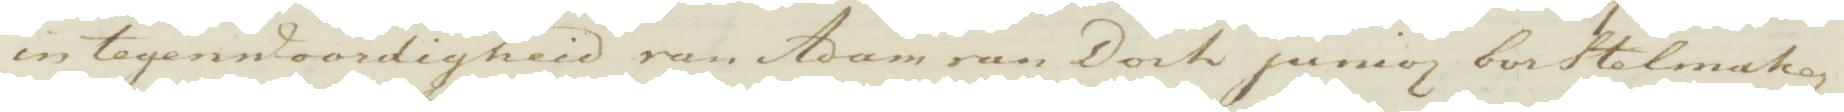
in tegenwoordigheid van Adam van Dort junior borstelmaker
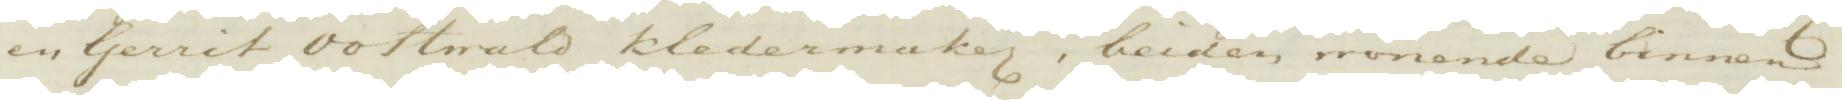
en Gerrit Oostwald kledermaker, beiden wonende binnen
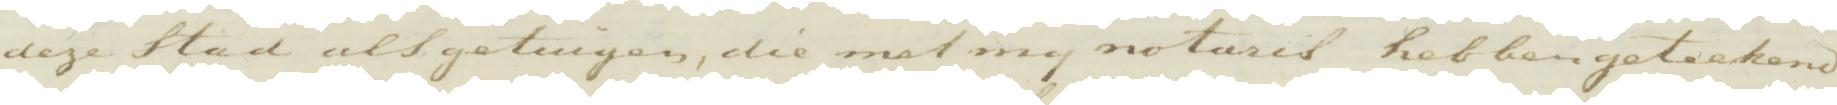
deze stad als getuigen, die met my notaris hebben geteekend
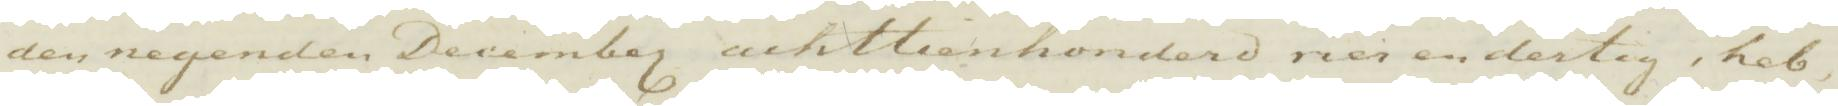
den negenden December achttienhonderd vier en dertig, heb
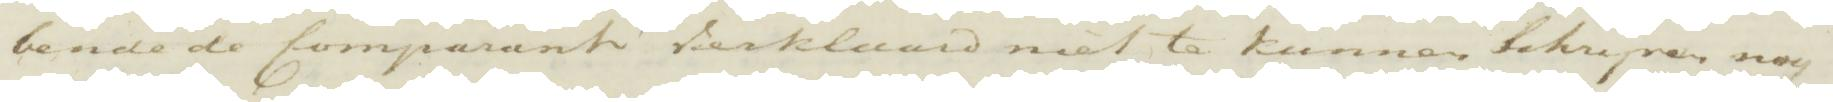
bende de Comparant verklaard niet te kunnen schryven nog
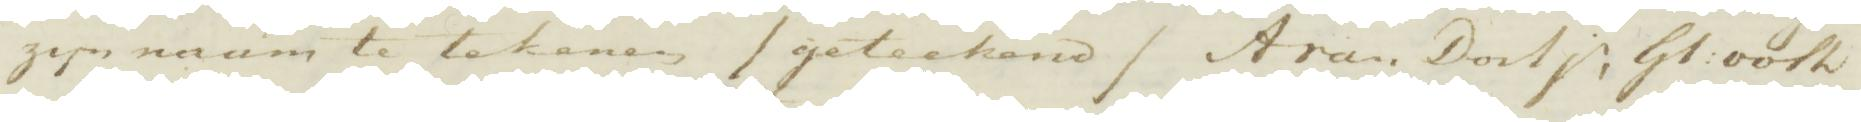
zyn naam te tekenen / geteekend / A van Dort j,r Gt: oost
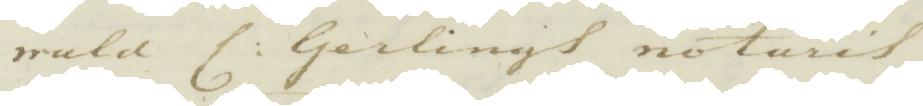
wald C: Gerlings notaris
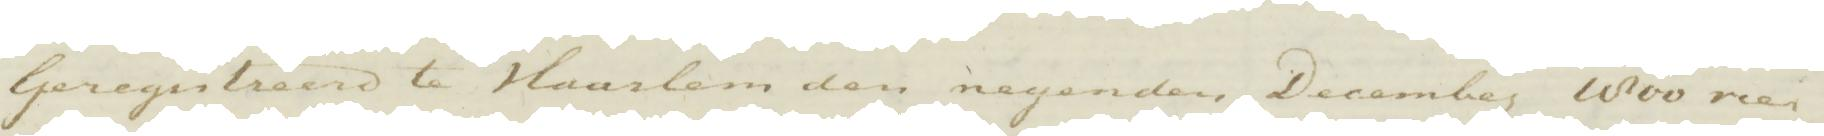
Geregistreerd te Haarlem den negenden December 1800 vier
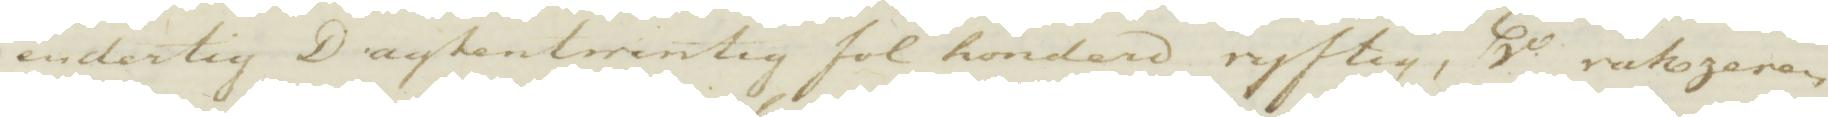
endertig D'agtentwintig fol honderd vyftig, V.o vak zeven
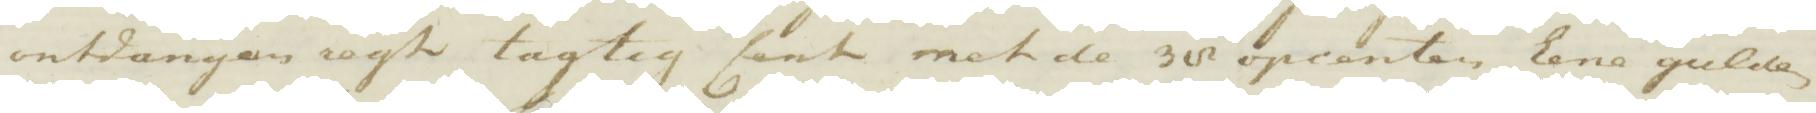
ontvangen regt tagtig Cent met de 38 opcenten Eene gulden
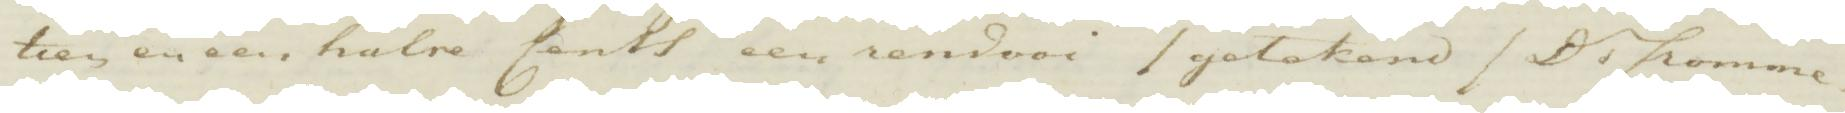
tien en een halve Cents een renvooi /getekend / D: Cromme
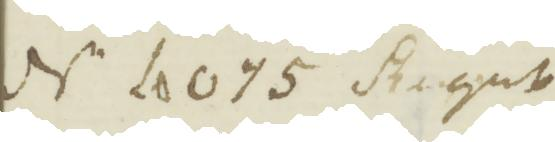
No 4075 Regul
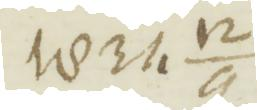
1834 12/9
